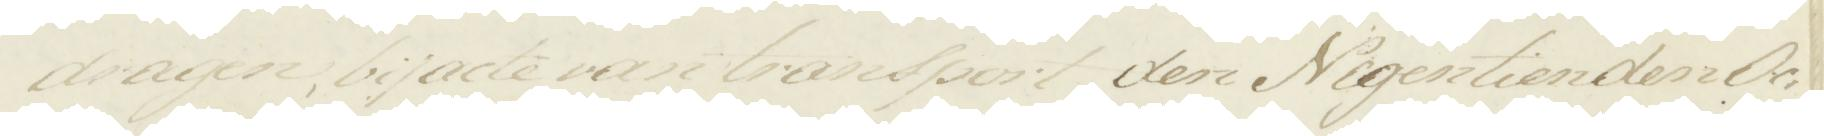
dragen, bij acte van transport den Negentienden Oc,
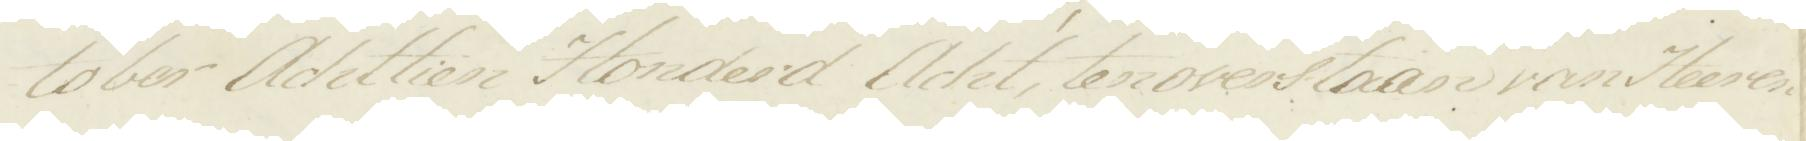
tober Achttien Honderd Acht, ten overstaan, van Heeren
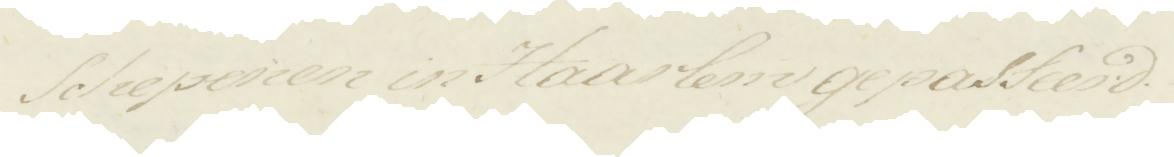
schepenen in Haarlem gepasseerd.
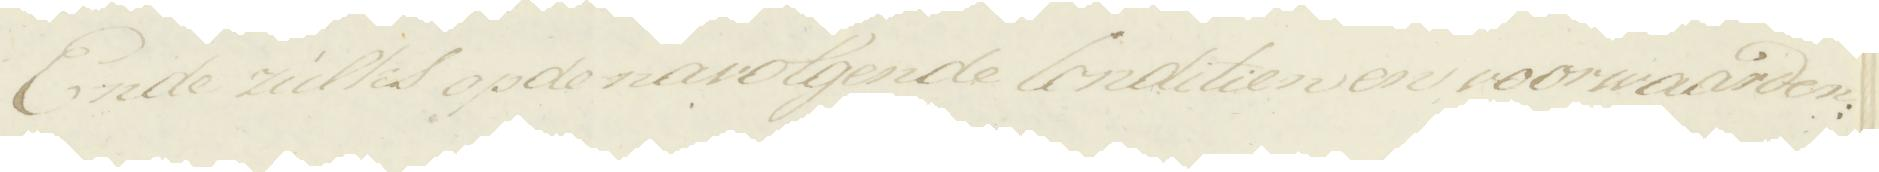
Ende zulks op de navolgende Conditien en voorwaarden:
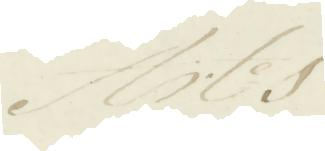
Artl 1
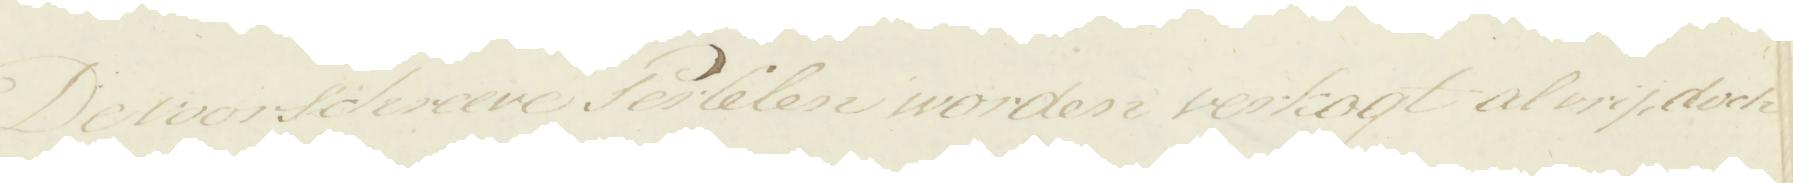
De voorschreeve Perselen worden verkogt al vrij, doch
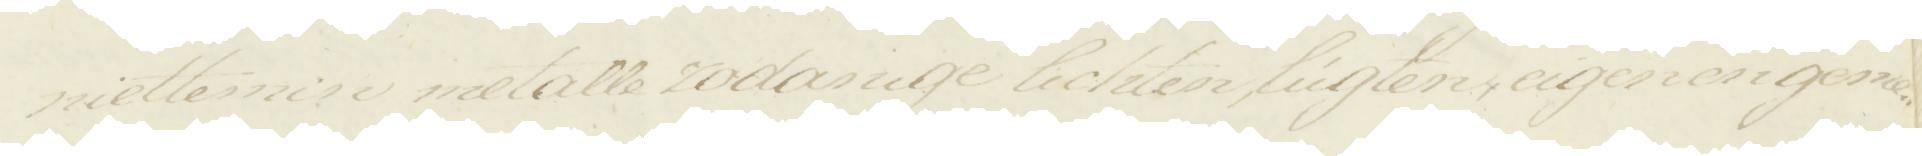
niettemin met alle zodanige lichten, lugten, eigen en gene
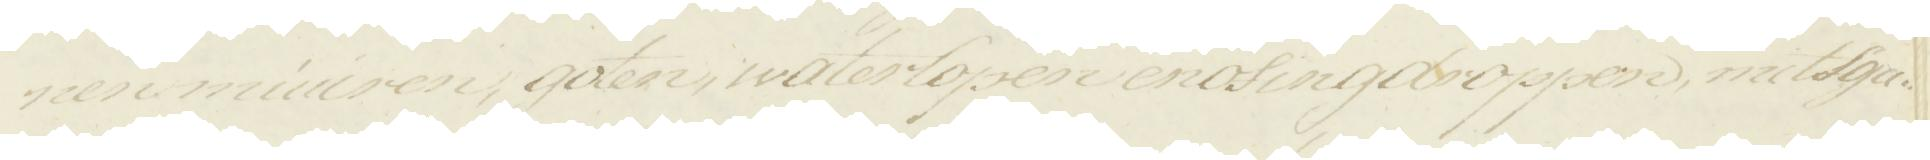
rale muuren, goten, waterlopen en osingdroppen, mitsga„
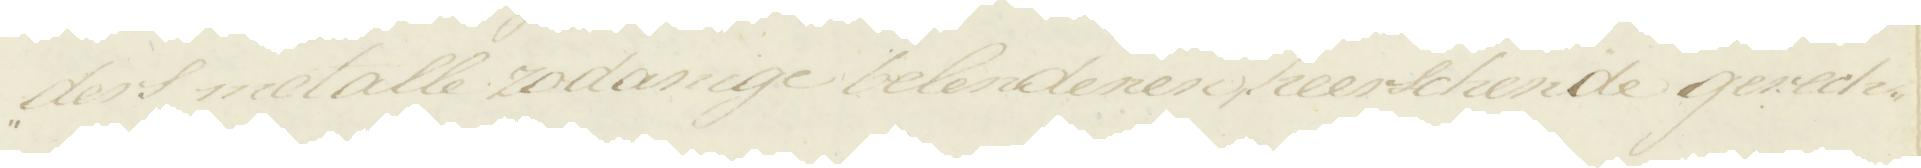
„ders met alle zodanige belendenen, heerschende gerech„
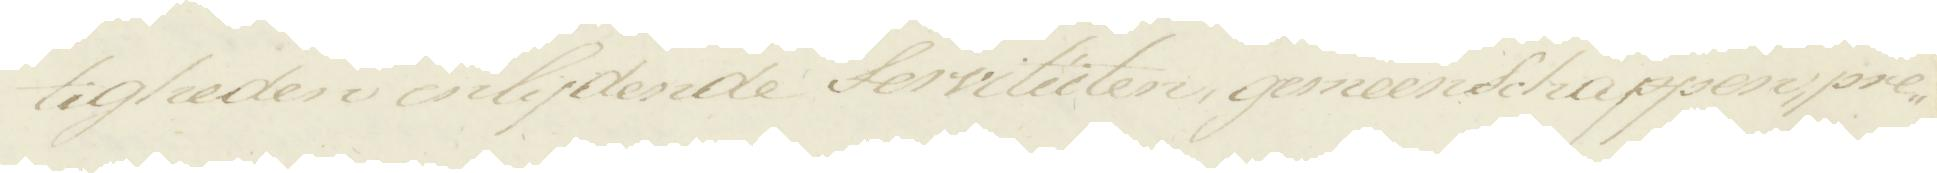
tigheden en lijdende serviteiten, gemeenschappen, pre„
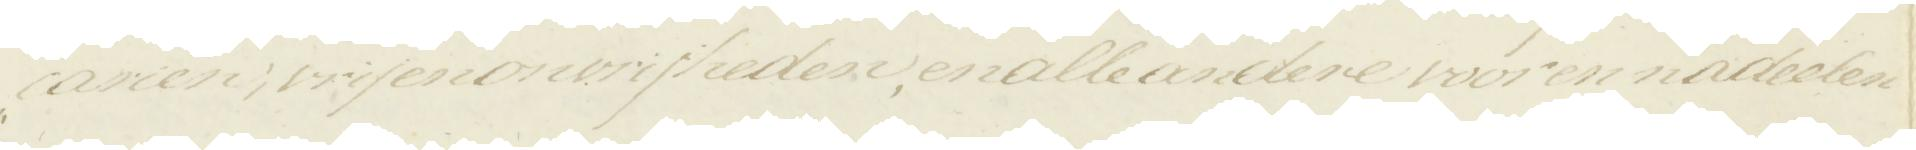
carien, vrij en onvrijheden, en alle andere voor en nadeelen
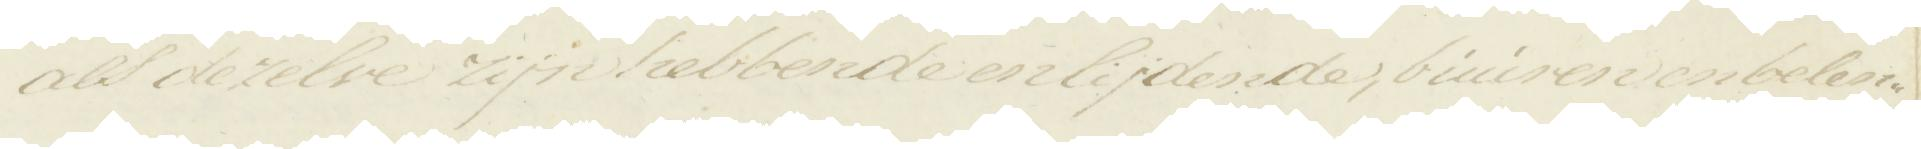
als dezelve zijn hebbende en lijdende, buuren en belen„
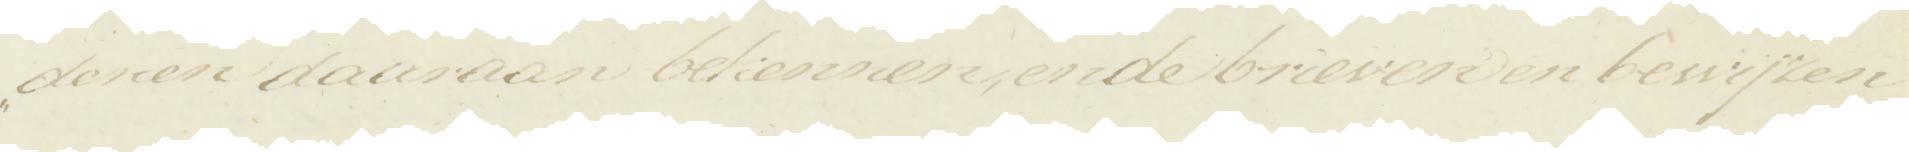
denen daaraan bekennen, en de brieven en bewijzen
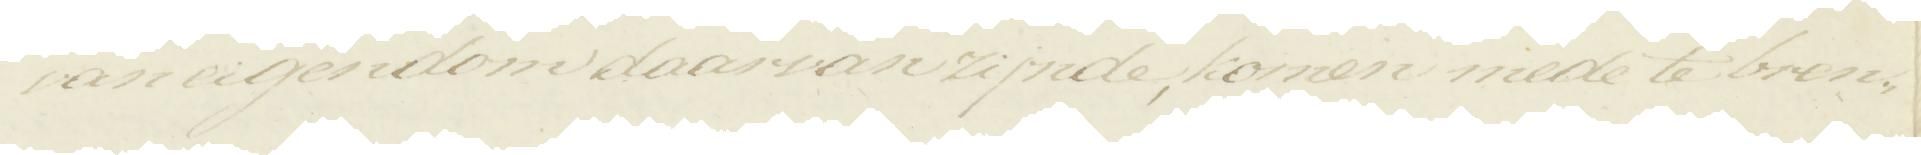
van eigendom daar van zijnde, komen mede te bren„
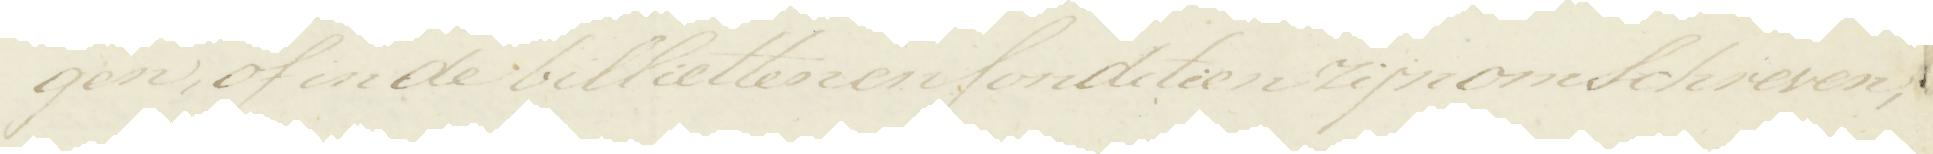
gen, of in de billietten en conditien zijn omschreven,
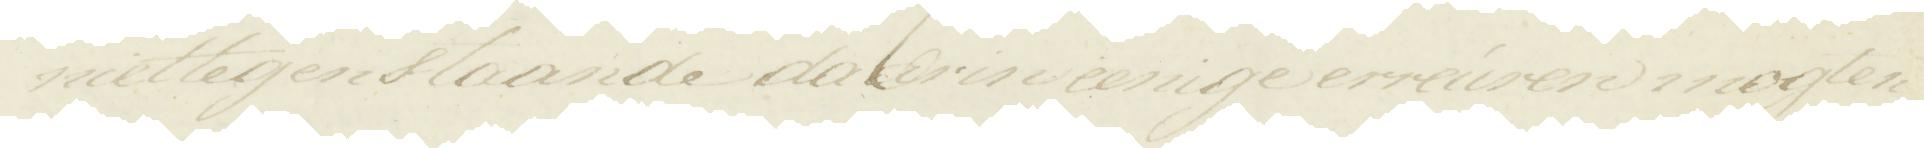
niet tegenstaande daerin eenige erreuren mogten
